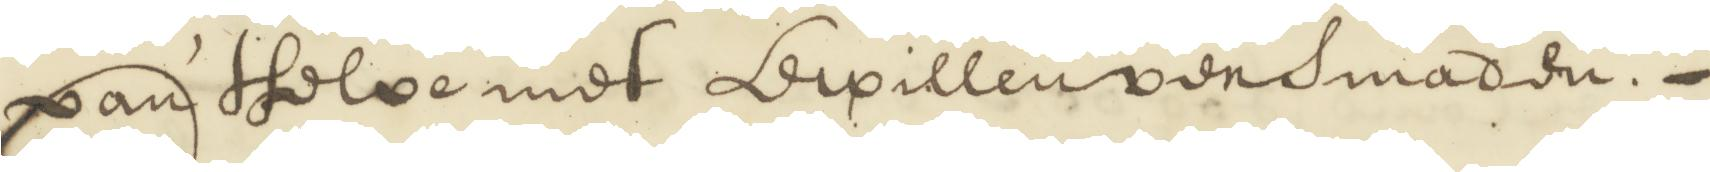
van 'tselve niet tewillen versmaden.–
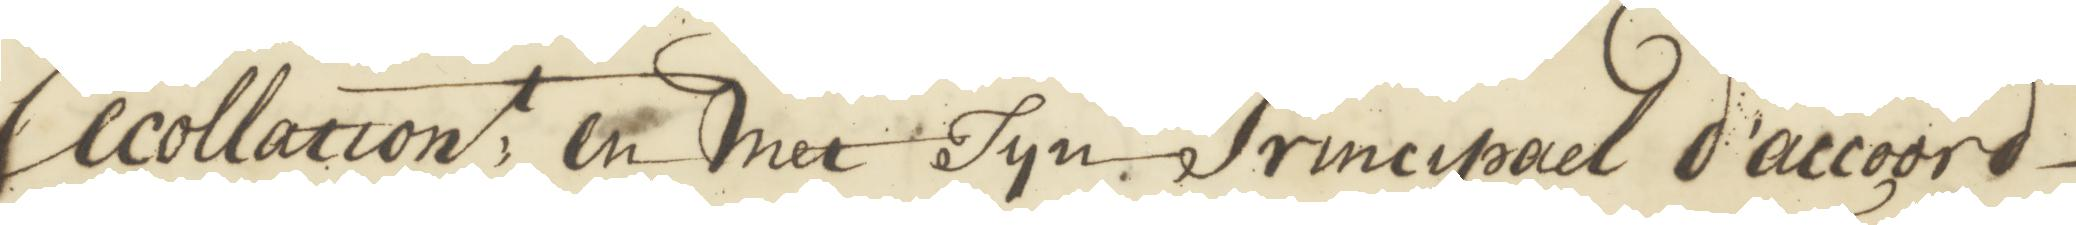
Gecollation;t en met sijn Principael d’accoord
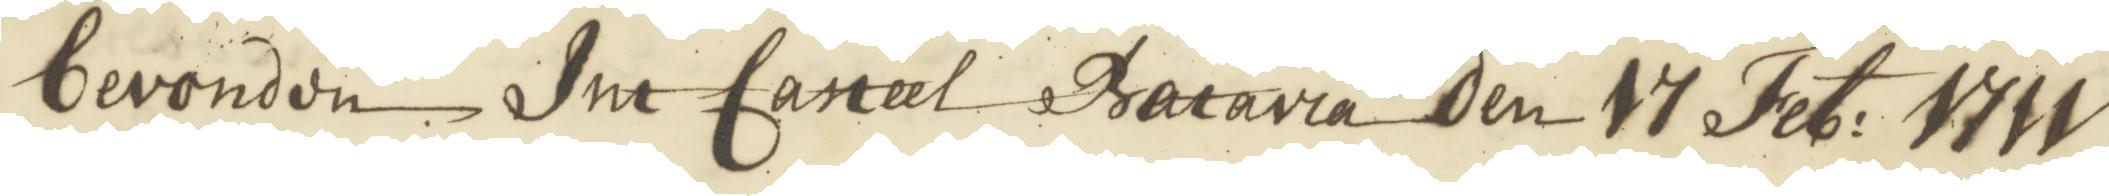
bevonden Int Casteel Batavia den 17 Feb: 1711
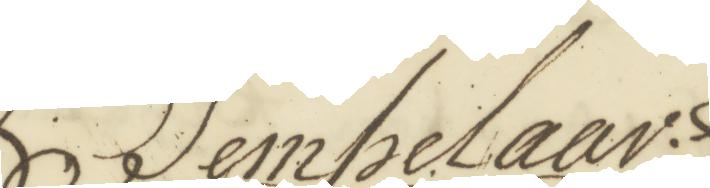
Tempelaar:
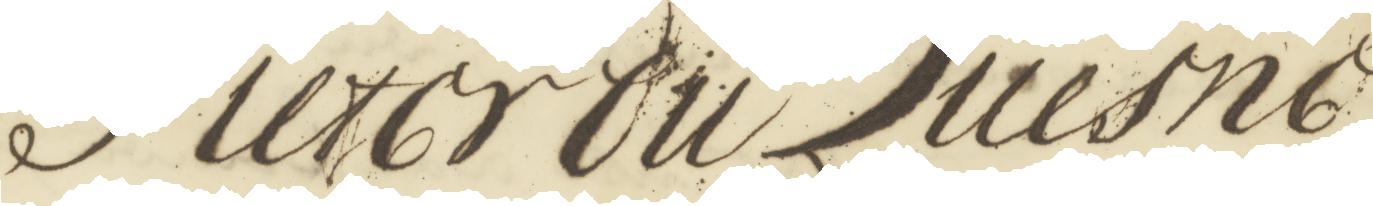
Pieter du Quesne
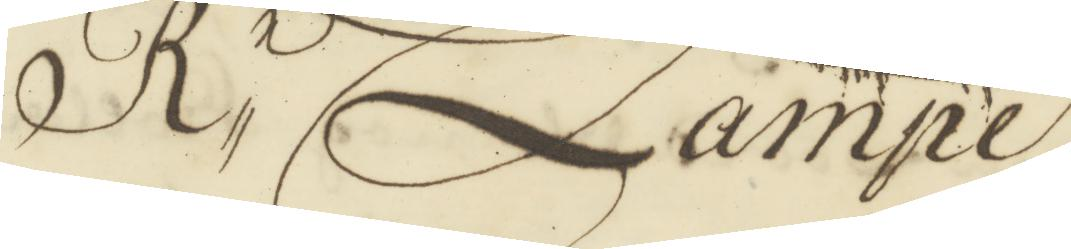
R„r Lampe.
